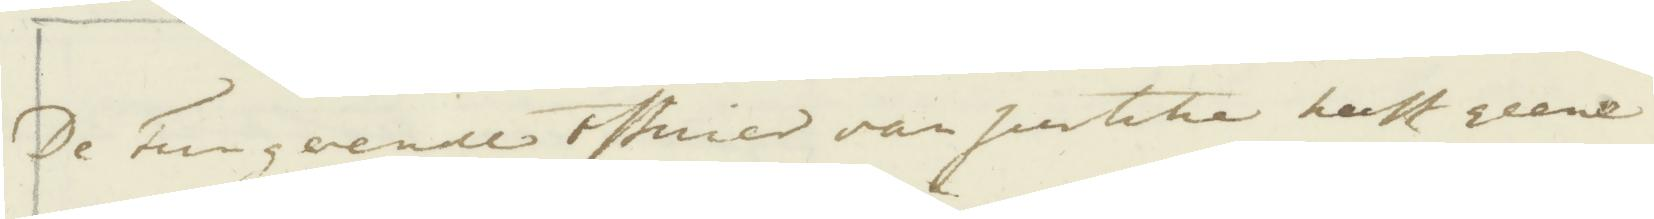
De Fungerende officier van justitie heeft geene
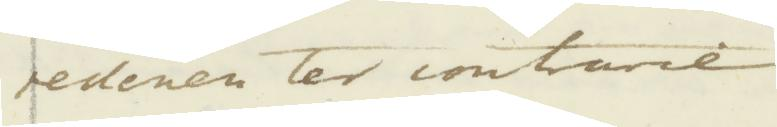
rederen ter contrarie.
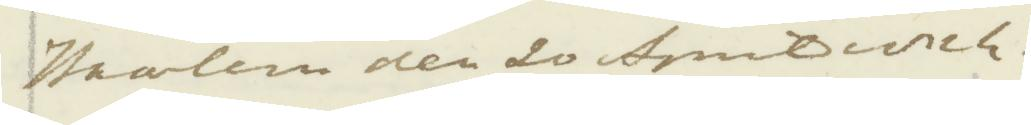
Haalem den 20 April 1824.
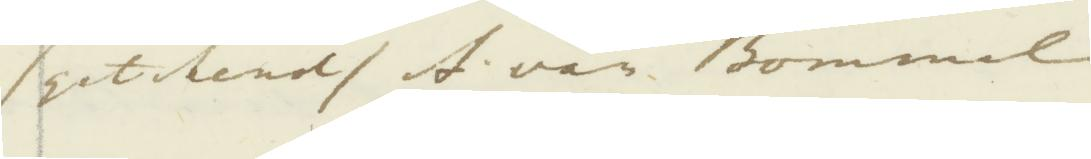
/getekend/ A. van Bommel
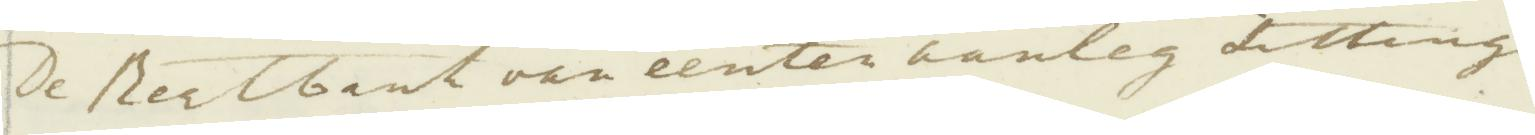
de Regtbank van eersten aanleg zitting
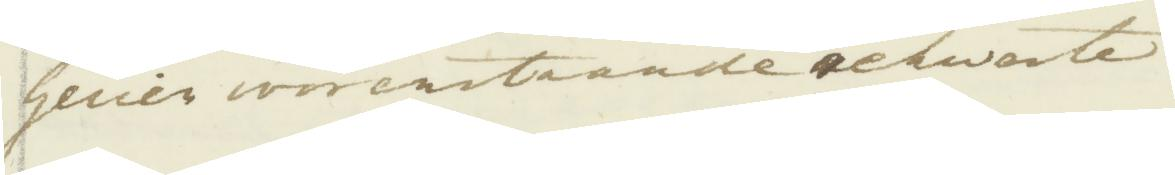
Gezien voorenstaande rekweste.
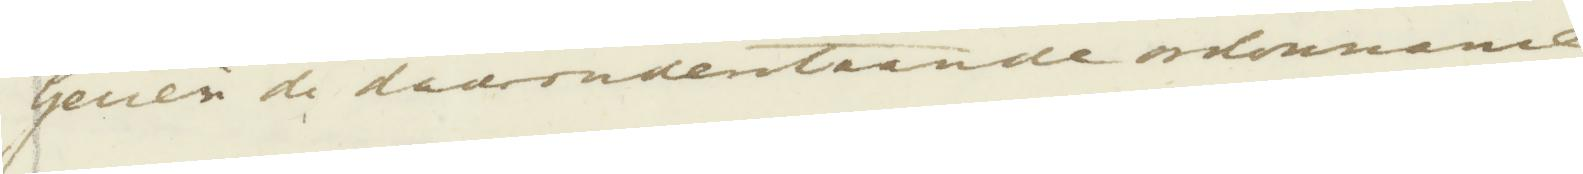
Gezien de daaronderstaande ordonnance
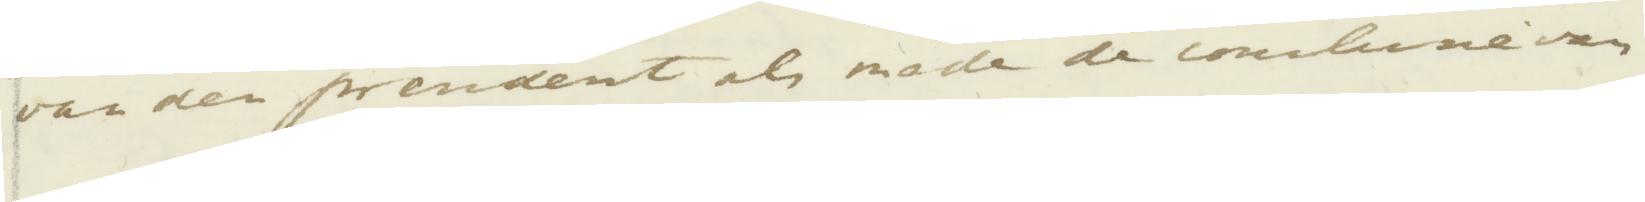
van den president, als made de conclusie van
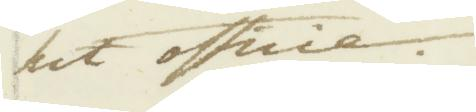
het officie.
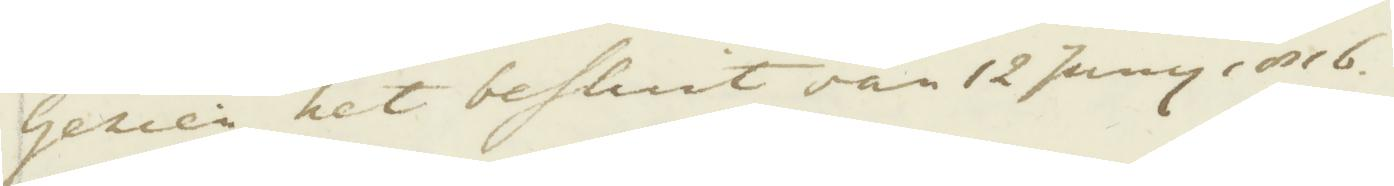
Gezien het besluit van 12 Juny 1816.
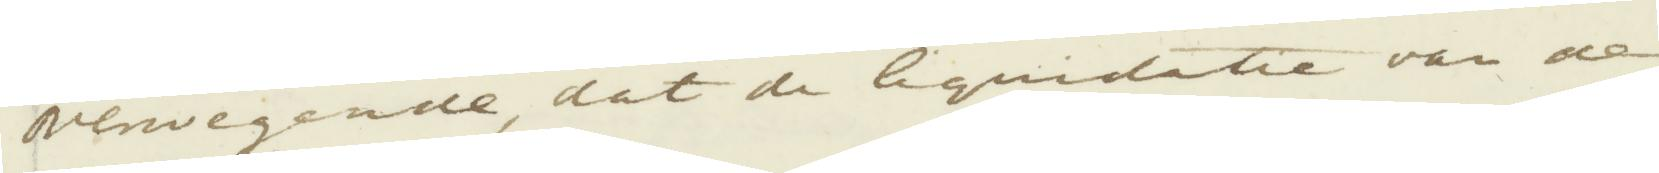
overwegende, dat de liquidatie van de
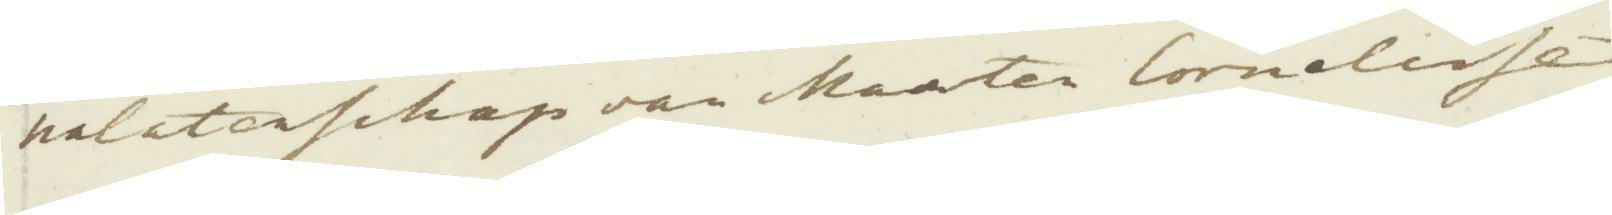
nalatenschap van Maarten Cornelisse
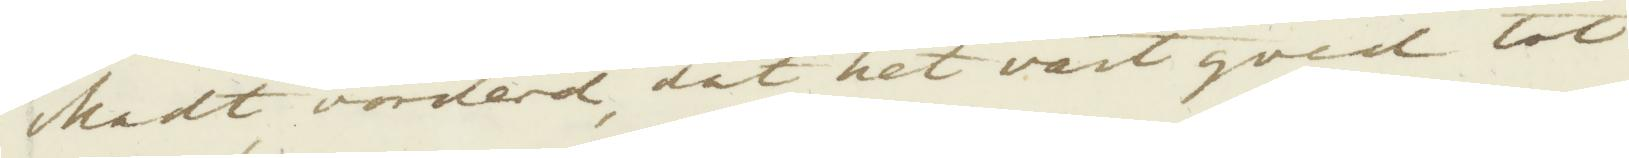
Madt, vorderd, dat het vast goed tot
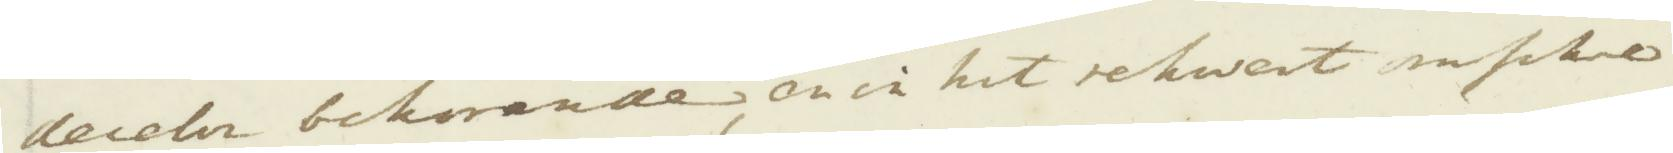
dezelve behorende, en in het rekwest omschre
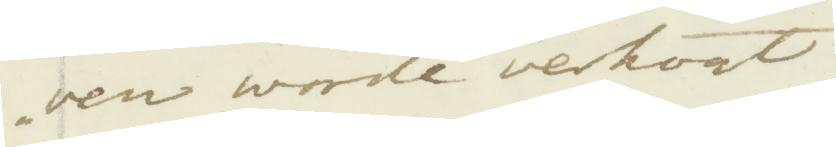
„ven worde verkogt.
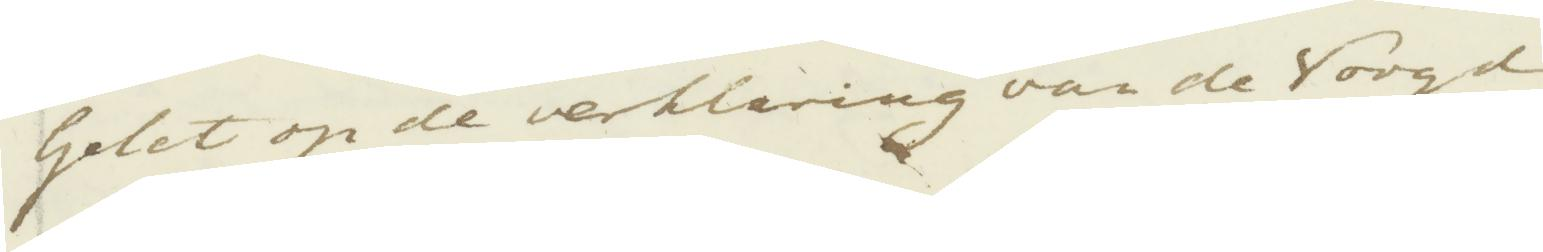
Gelet op de verklaring van de Voogd
